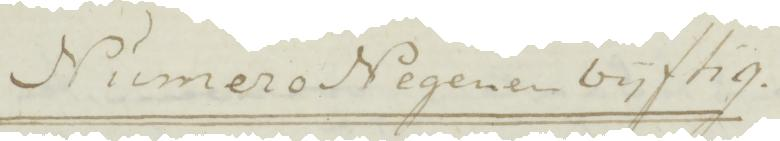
Numero Negen en vijftig.
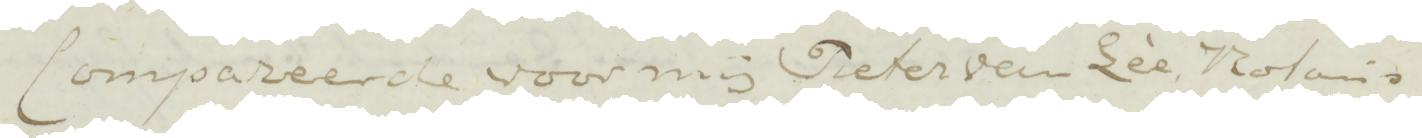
Compareerde voor mij Pieter ven Lee, Notaris
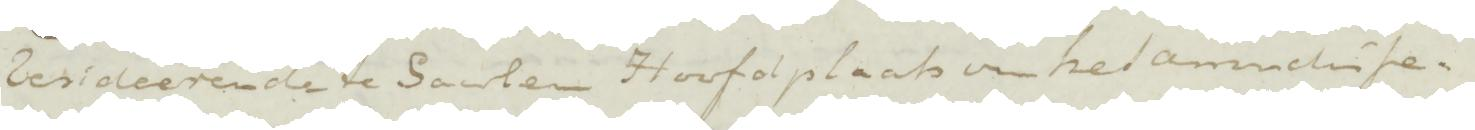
residerende te haarlem Hoofdplaats in het arrondisse-
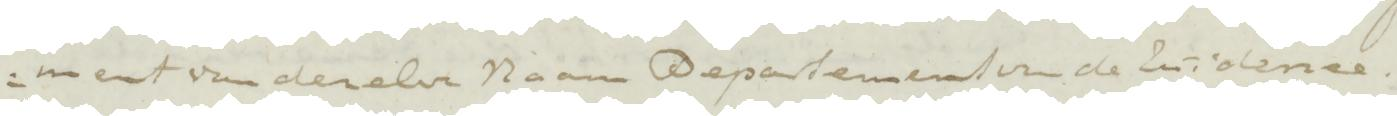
=ment van dezelve Naam Departement van de Zuiderzee
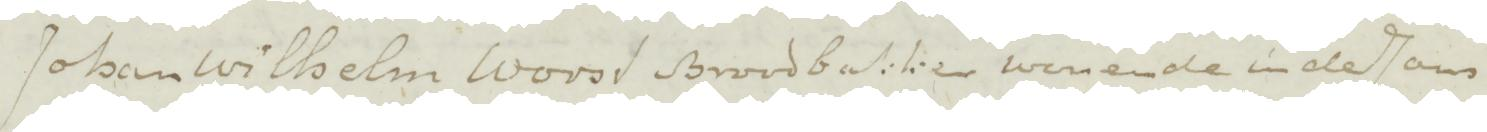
Johan Wilhelm Worst Broodbakker wonende in de Jans
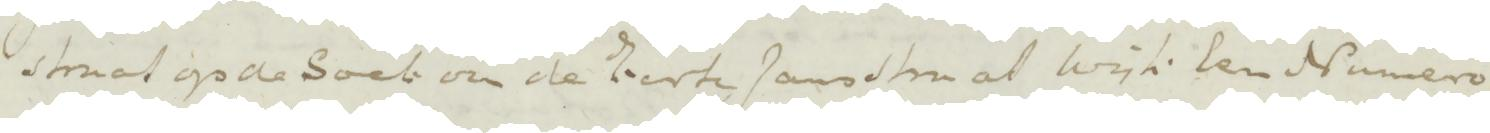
straat op de hoek in de Korte Janstraat wijk Een Numero
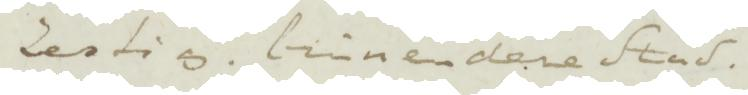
zestig , binnen deze Stad.
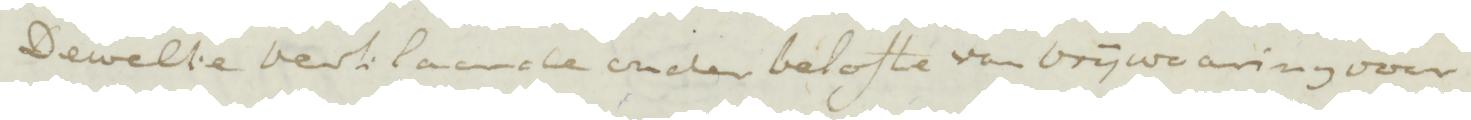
Dewelke verklaarde onder belofte van vrijwaaring voor
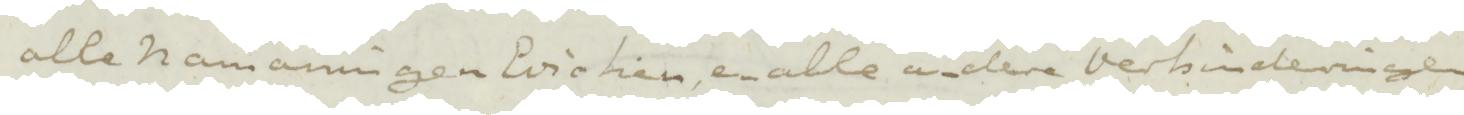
alle namaningen Evictien, en alle andere verhinderingen
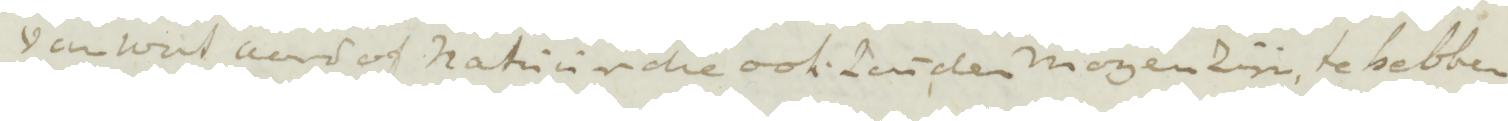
van wat aard of Natuur die ook zouden mogen Zijn, te hebben
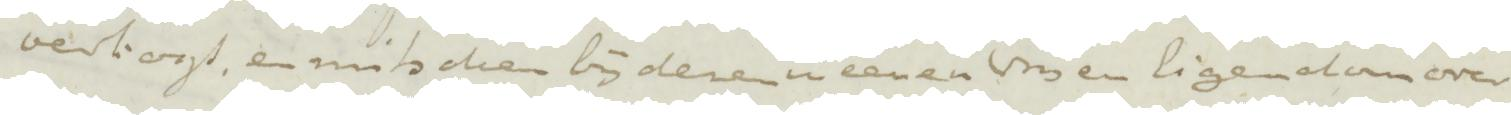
verkogt, en mitsdien bij desen in eenen vrijen Eigendom over
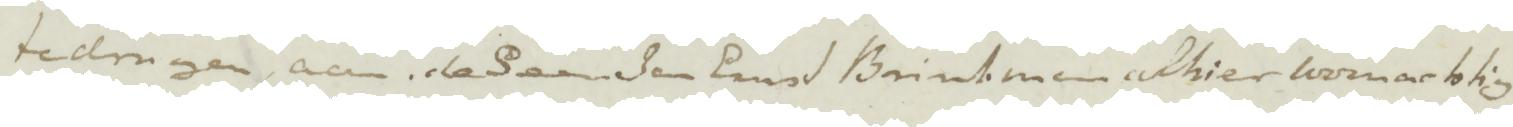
te dragen, aan, de heer Jan Ernst Brinkman alhier woonachtig
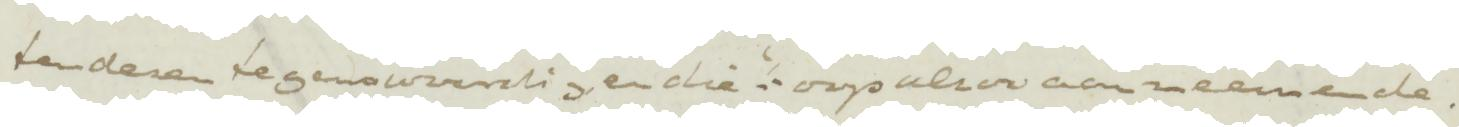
ten dezen tegenwoordig en die koop alzoo aannemende
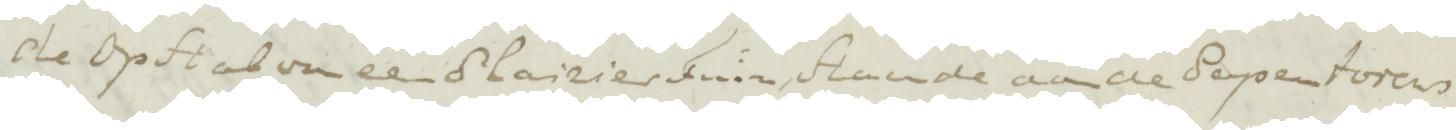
de opstal van Plaizier Tuin, Staande aan de Papentoren
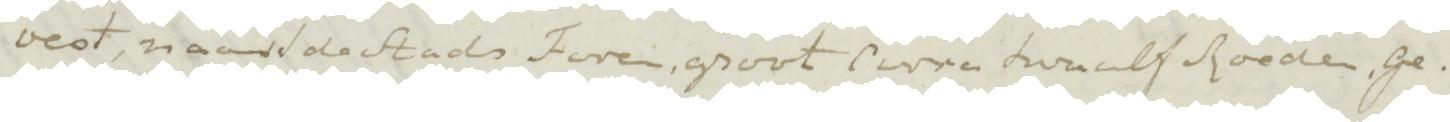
vest, naast de stads Toren, groot circa twaalf Roeden, g.
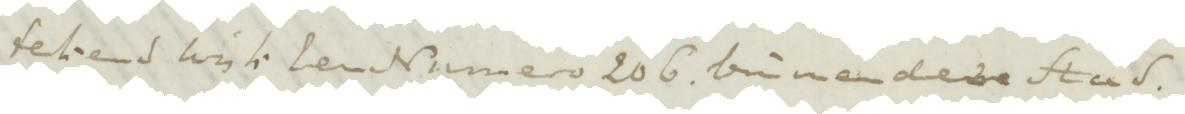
tekend Wijk Een Numero 206, binnen deze Stad,
